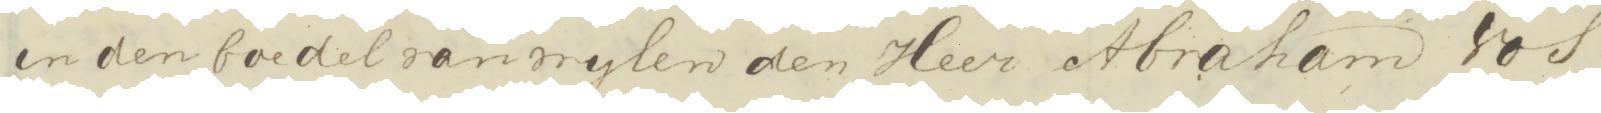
in den boedel van wylen den Heer Abraham Vos
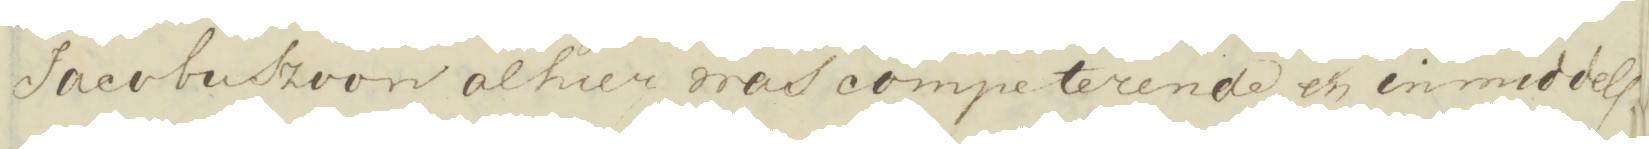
Jacobuszoon alhier was competerende en inmiddels
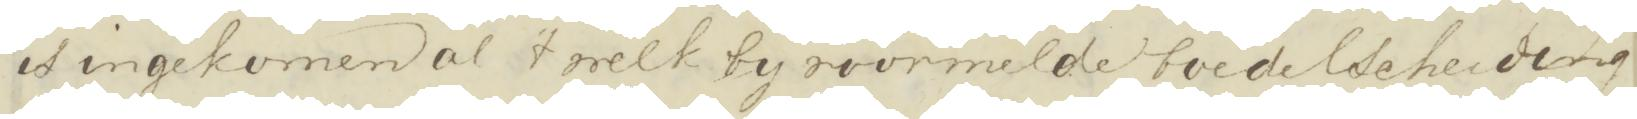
is ingekomen al 't welk by voormelde boedelscheiding
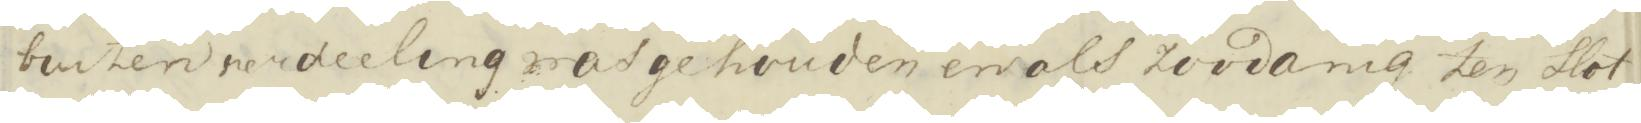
buiten verdeeling was gehouden en als zoodanig ten slot
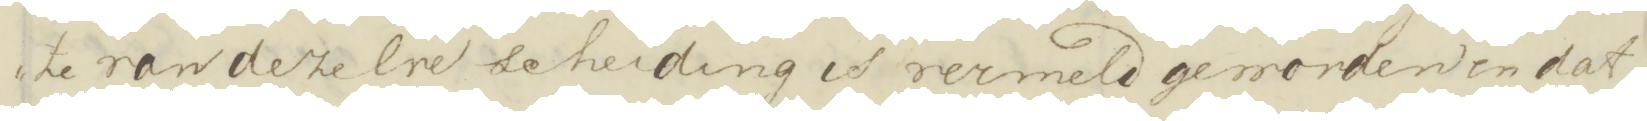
„te van dezelve scheiding is vermeld geworden en dat
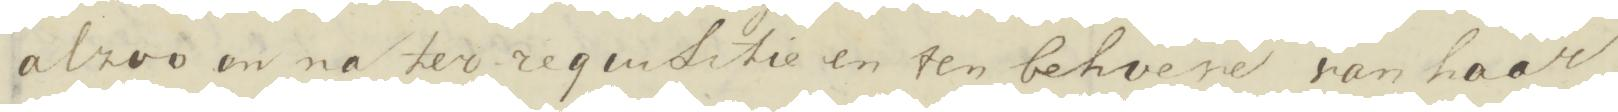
alzoo en na ter requisitie en ten behoeve van haar
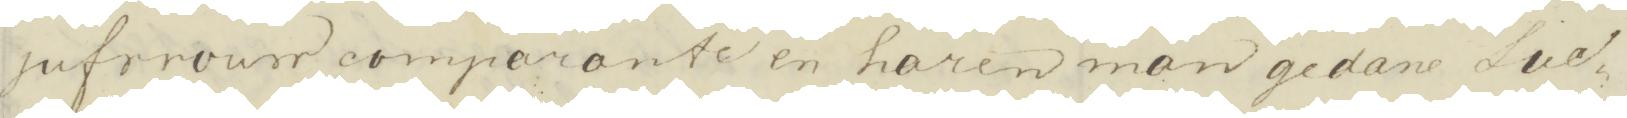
jufvrouw comparante en haren man gedane suc„
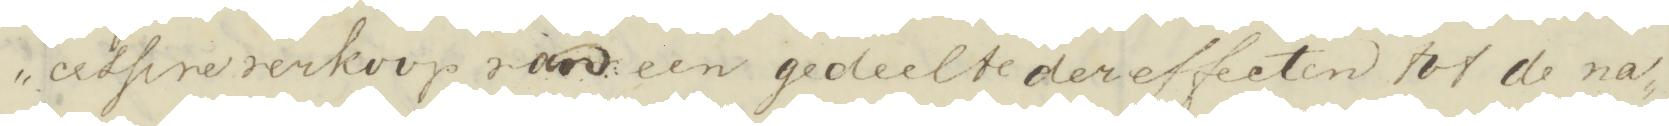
„cessive verkoop van een gedeelte der effecten tot de na„
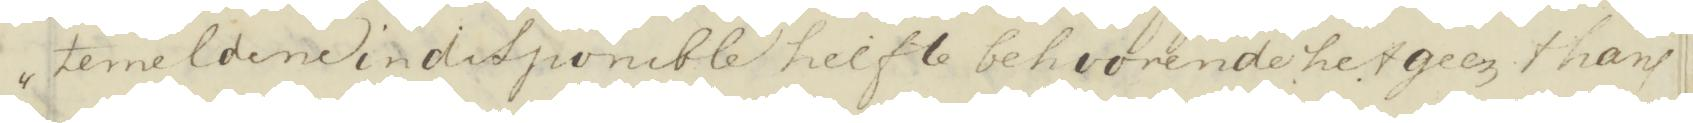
„temeldene in disponible helfte behoorende hetgeen thans
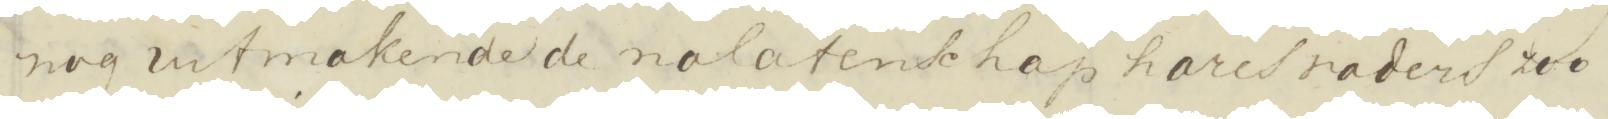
nog uitmakende de nalatenschap hares vaders zoo
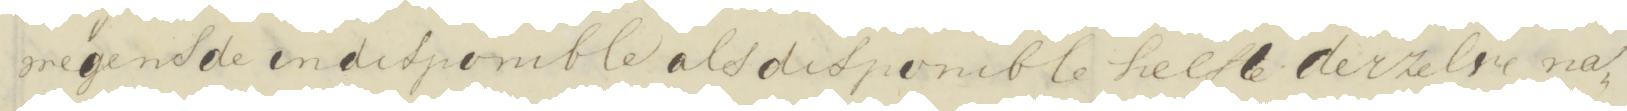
wegens de indisponible als disponible helft derzelve na„
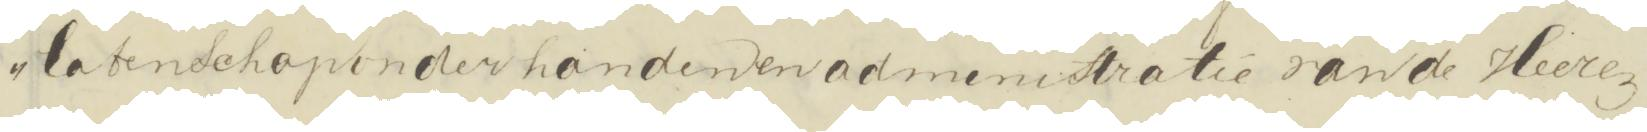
„latenschap onder handen en administratie van de Heeren
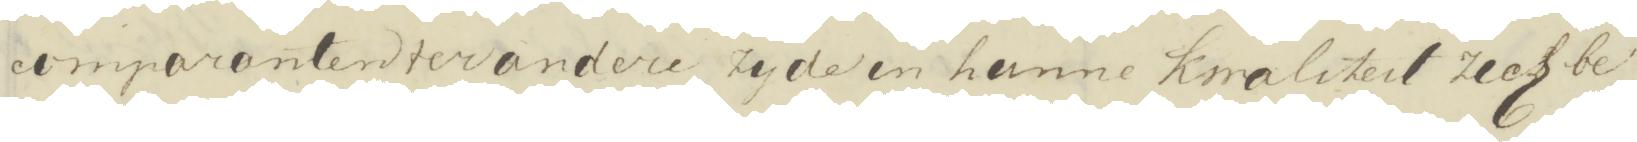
comparanten ter andere zyde in hunne kwaliteit zich be
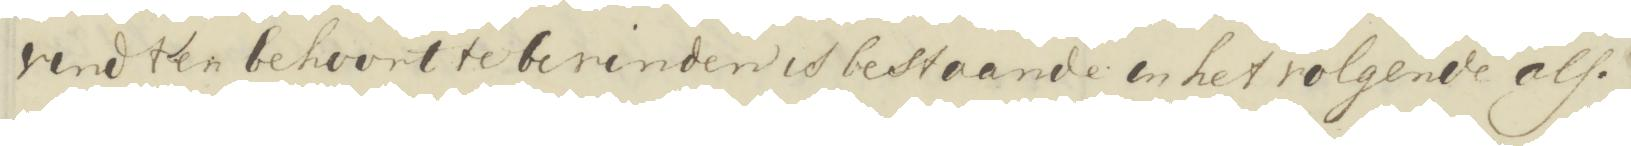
vindt en behoort te bevinden is bestaande in het volgende als.
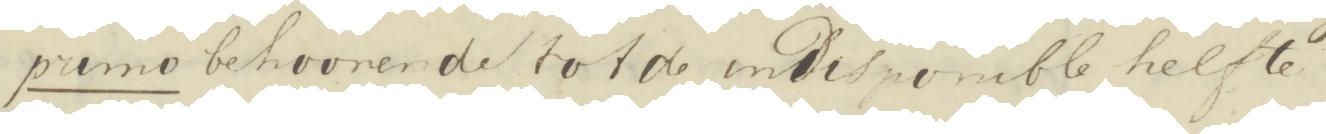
primo behoorende tot de ondisponible helfte.
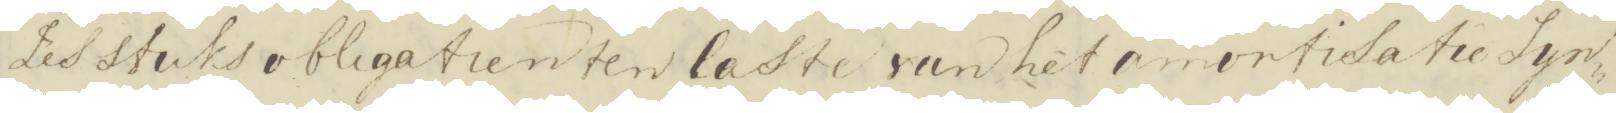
zes stuks obligatien ten laste van het amortisatie syn„
